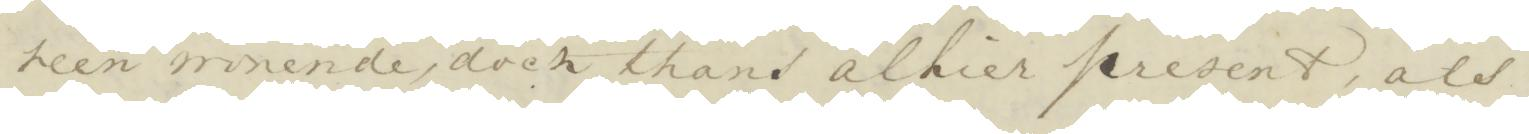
veen wonende, doch thans alhier present, als
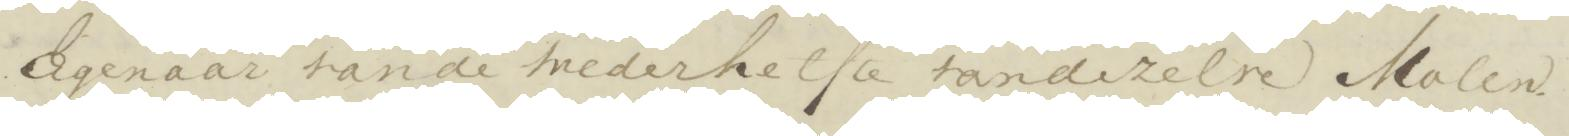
Eigenaar van de wederhelfte van dezelve Molen.
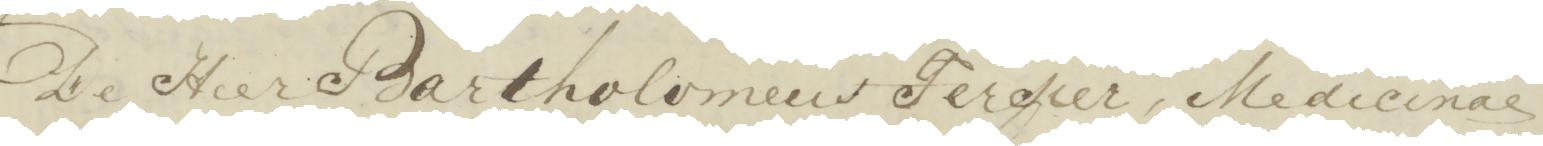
De Heer Bartholomeus Tercker, Medicinal
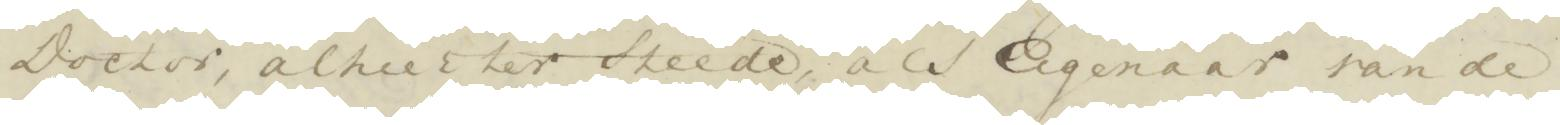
Doctor, alhier ter steede, als Eigenaar van de
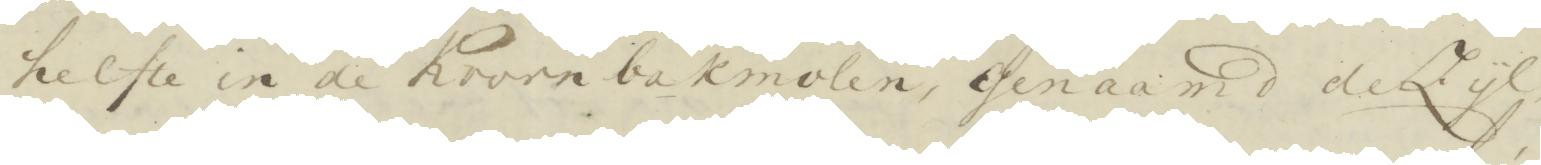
helfte in de Koornbakmolen, genaamd de Zijl,
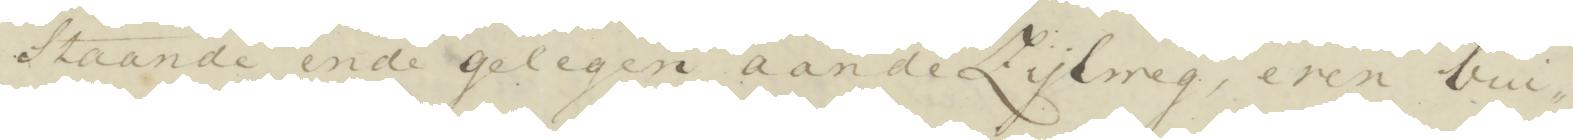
staande ende gelegen aan de Zijlweg, even bui„
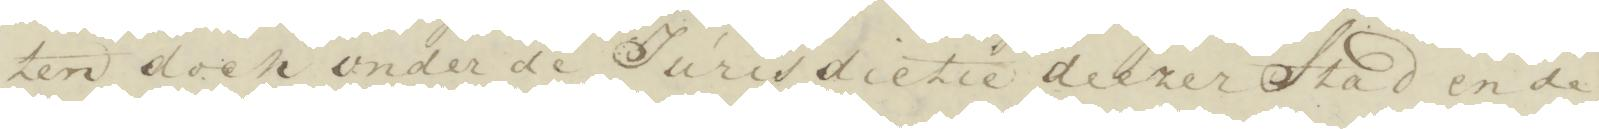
ten doch onder de Jurisdictie deezer Stad en de
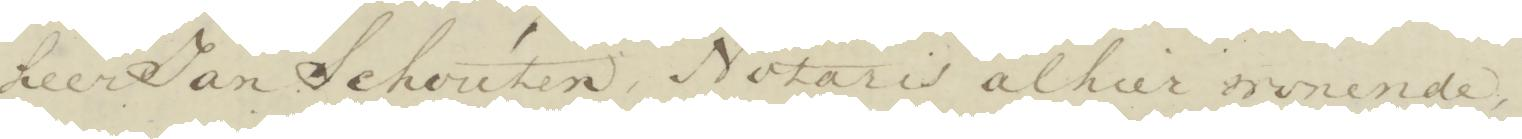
heer Jan Schouten, Notaris alhier wonende,
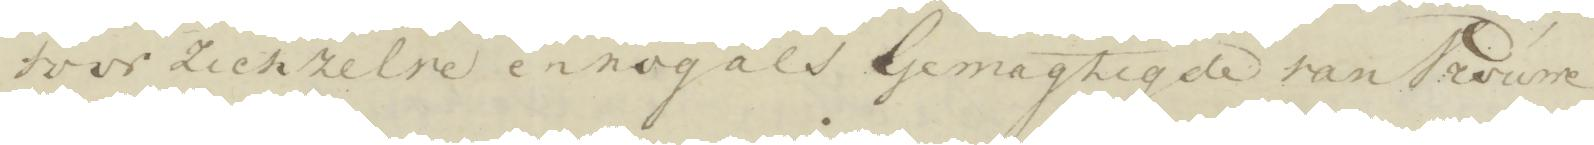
voor zichzelve en nog als Gemagtigde van Vrouwe
